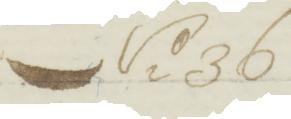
N=o 36
